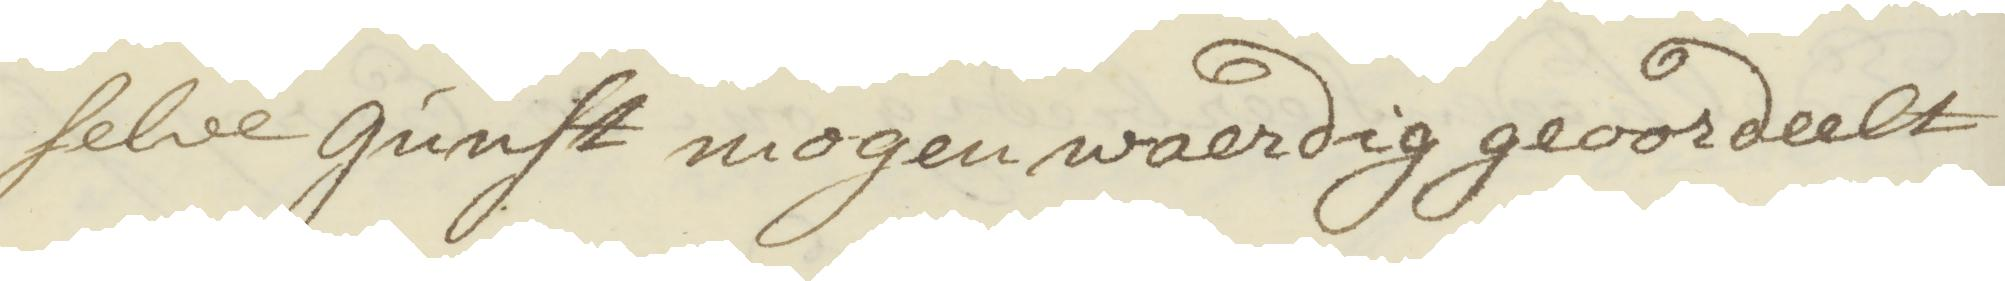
selve gunst mogen waerdig geoordeelt
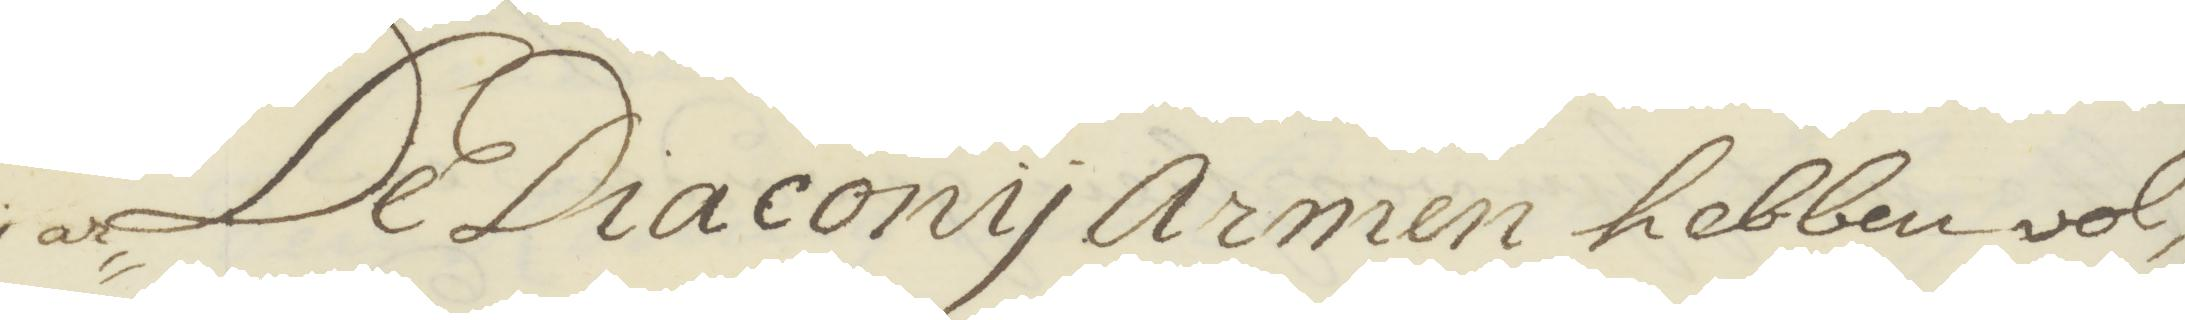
De Diaconij Armen hebben vol„
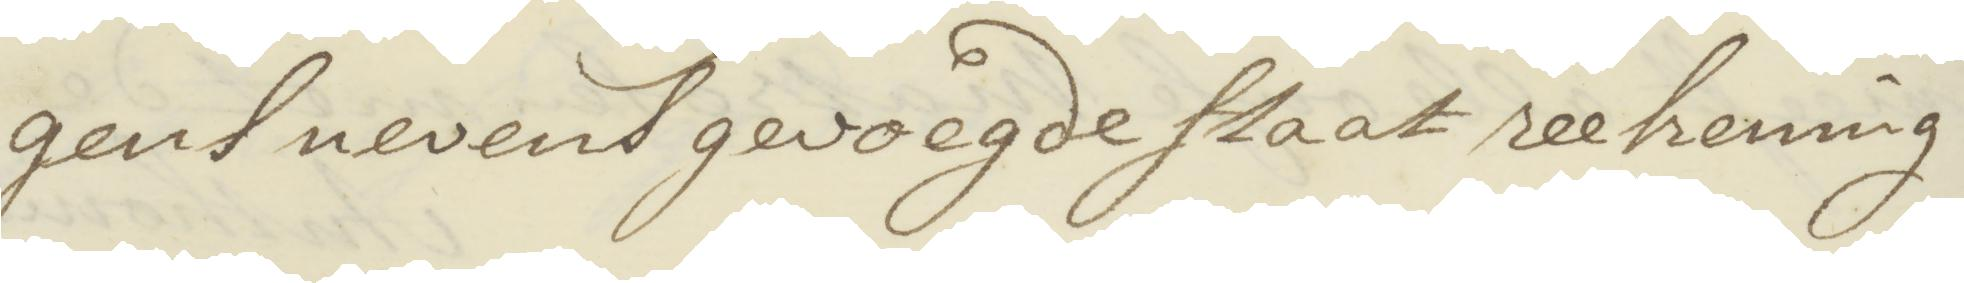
gens nevens gevoegde staat reekening
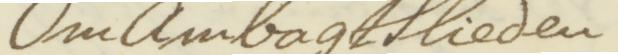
Om Ambagtslieden
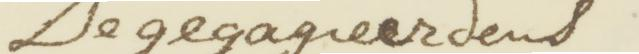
De gegagieerdens
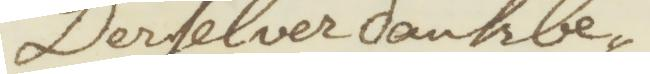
Derselver dankbe„
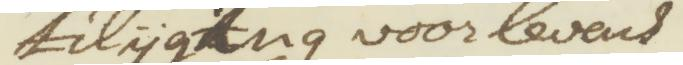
tuijging voor levens
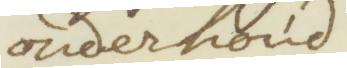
onderhoud
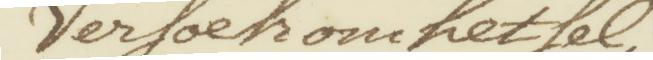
Versoek om het sel„
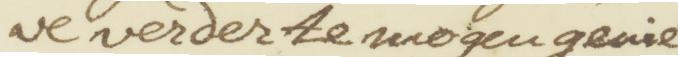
ve verder te mogen genie
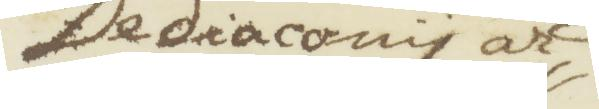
De diaconij ar„
